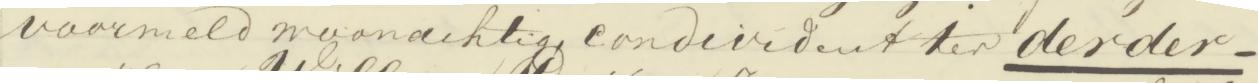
voormeld woonachtig, condivident ter derder-
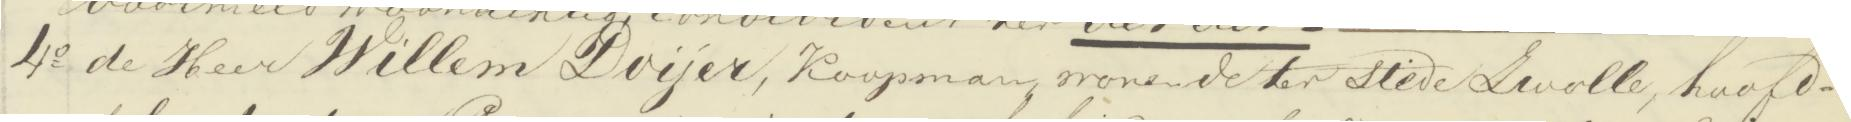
4=o de Heer Willem Doijer, Koopman, wonende ter stede Zwolle, hoofd-
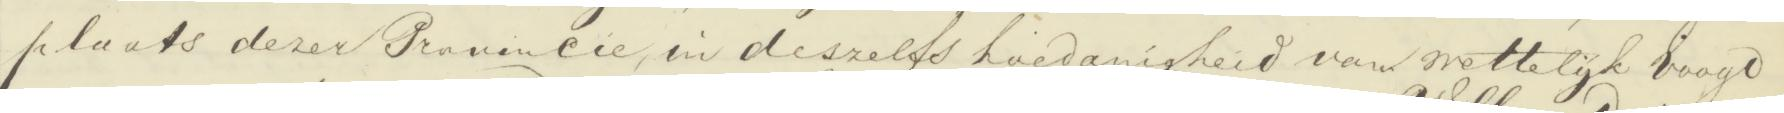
plaats dezer Provincie, in deszelfs hoedanigheid van wettelijk voogd
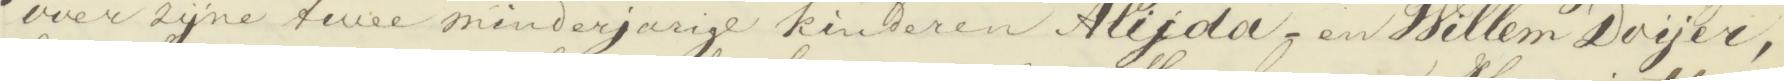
over zijne twee minderjarige kinderen Alijda, en Willem Doijer,
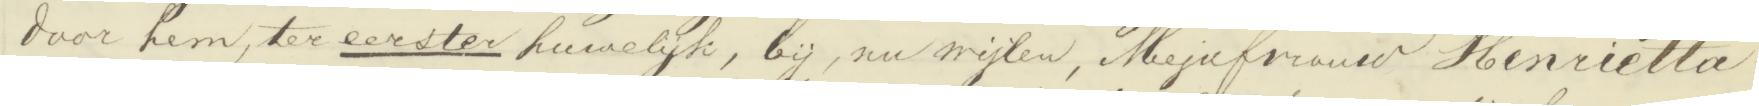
door hem, ter eerster huwelijk, bij, na wijlen, Mejufvrouw Henrietta
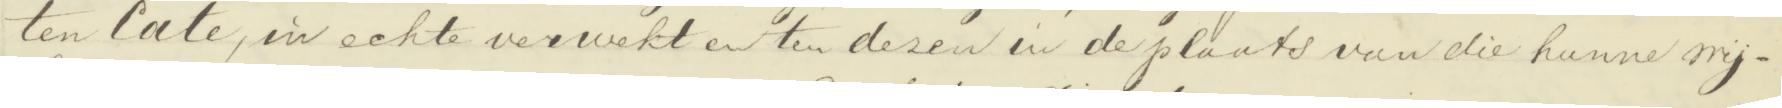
ten Cate, in echte verwekt en ten dezen in de plaats van die hunne wij-
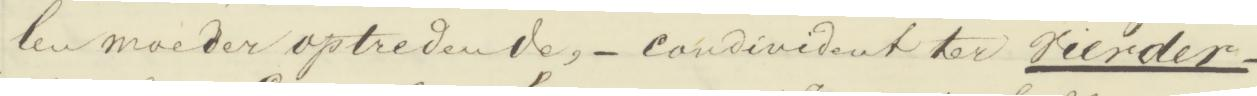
len moeder optredende, - condivident ter Vierder
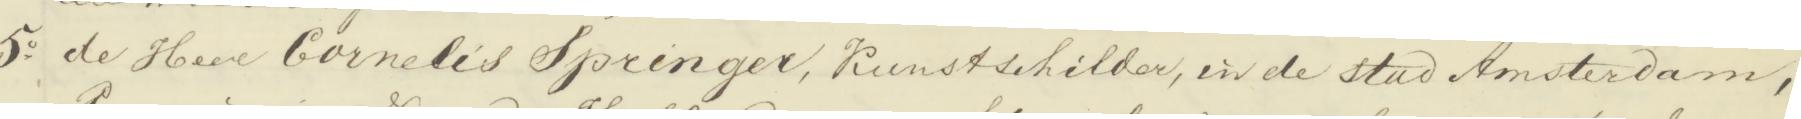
5: de Heer Cornelis Springer, Kunstschilder, in de stad Amsterdam,
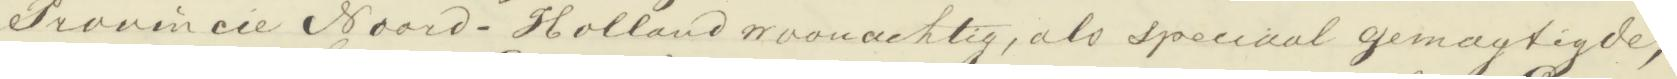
Provincie Noord-Holland woonachtig, als speciaal gemagtigde,
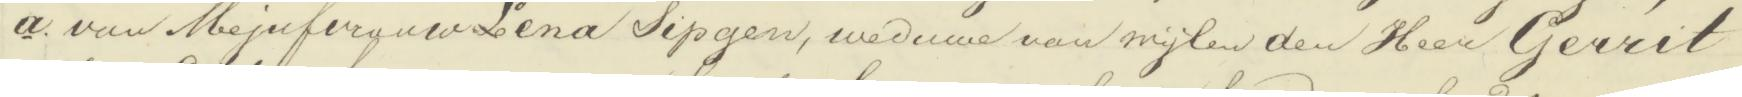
a. van Mejufvrouw Lena Sipgen, weduwe van wijlen den Heer Gerrit
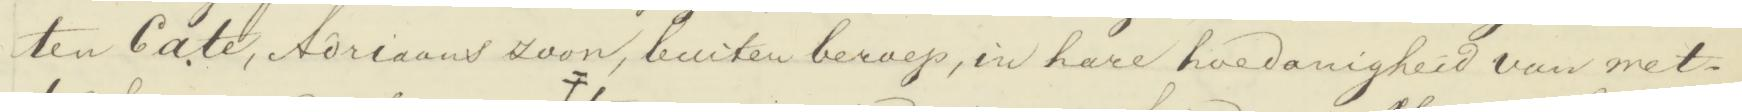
ten Cate, Adriaans zoon, buiten beroep, in hare hoedanigheid van wet-
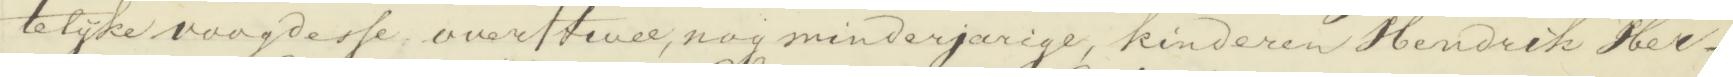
telijke voogdesse, over twee, nog minderjarige, kinderen Hendrik Her=
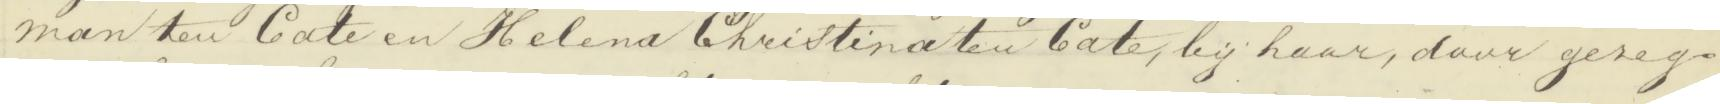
man ten Cate en Helena Christina ten Cate, bij haar, door gezeg
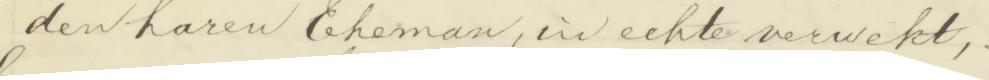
den haren Eheman, in echte verwekt,
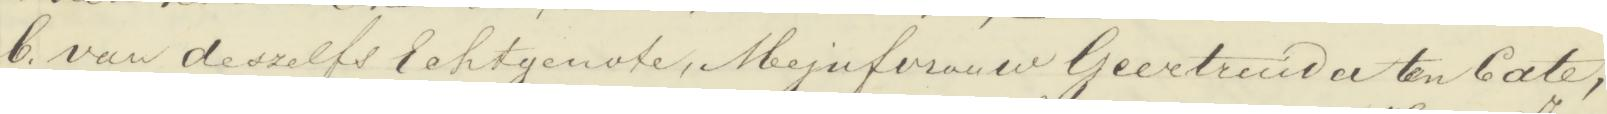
b: van deszelfs Echtgenote, Mejufvrouw Geertruida ten Cate,
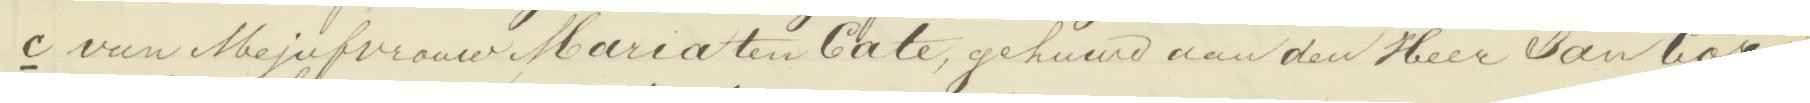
c van Mejufvrouw Maria ten Cate, gehuwd aan den Heer Ian Cor
